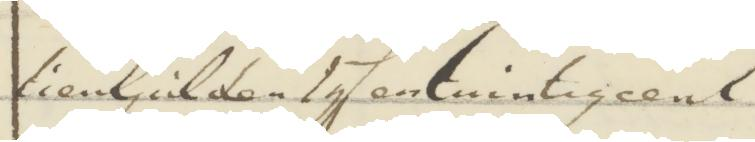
tien Gulden Vyfentwintig cent
